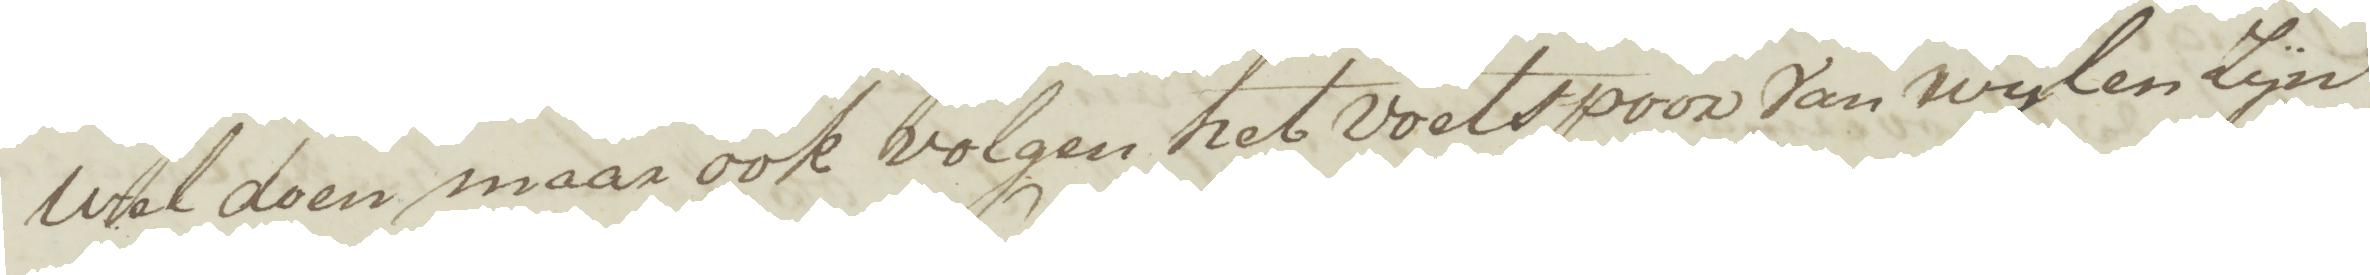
wel doen maar ook volgen het voetspoor van wijlen zijn
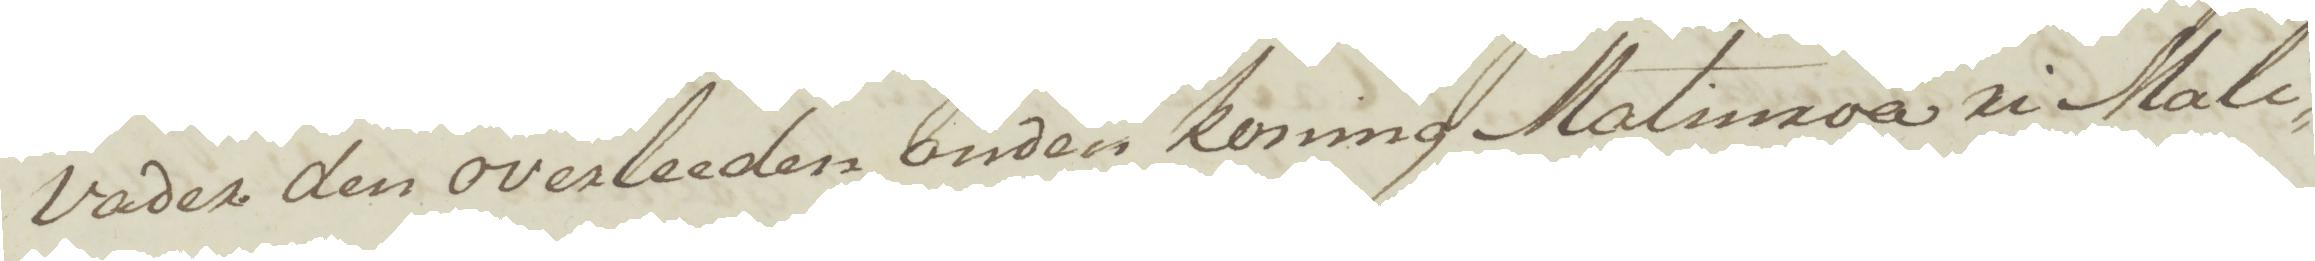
vader den overleeden ouden koning Matinroa ri Mali
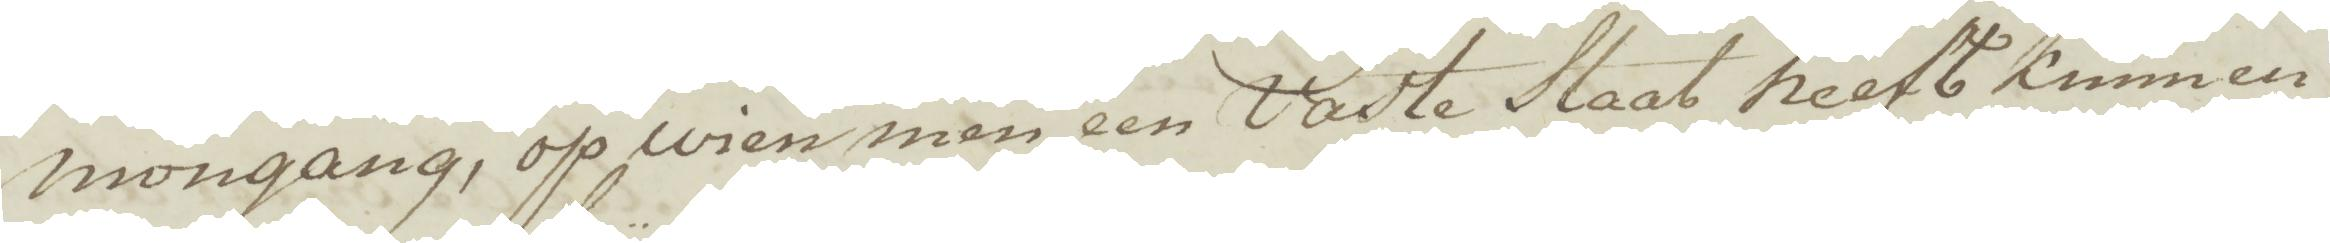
mongang, op wien men een vaste staat heeft kunnen
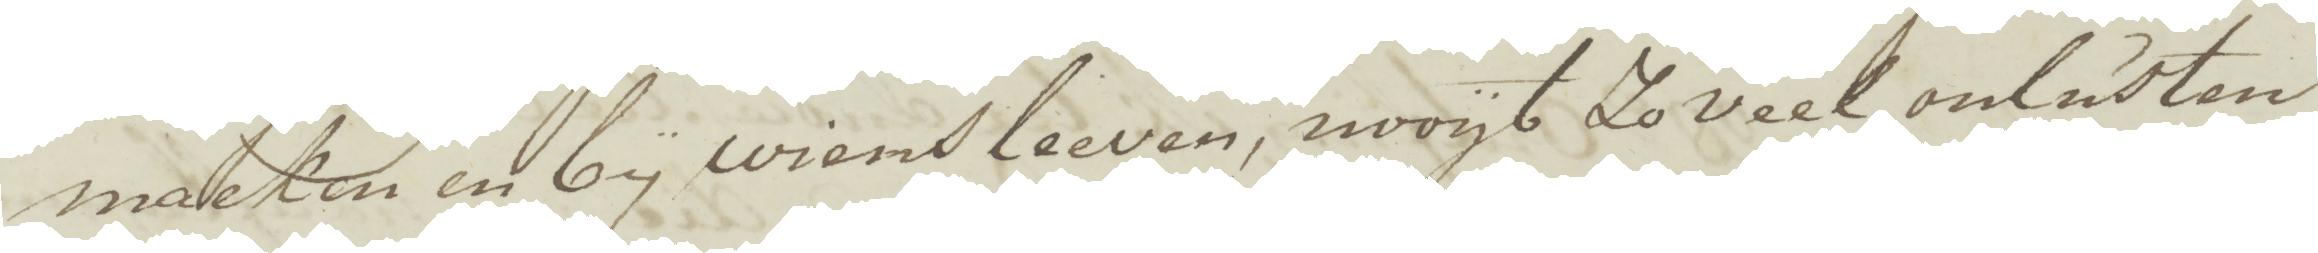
maeken en bij wiens leeven, nooijt zo veel onlusten
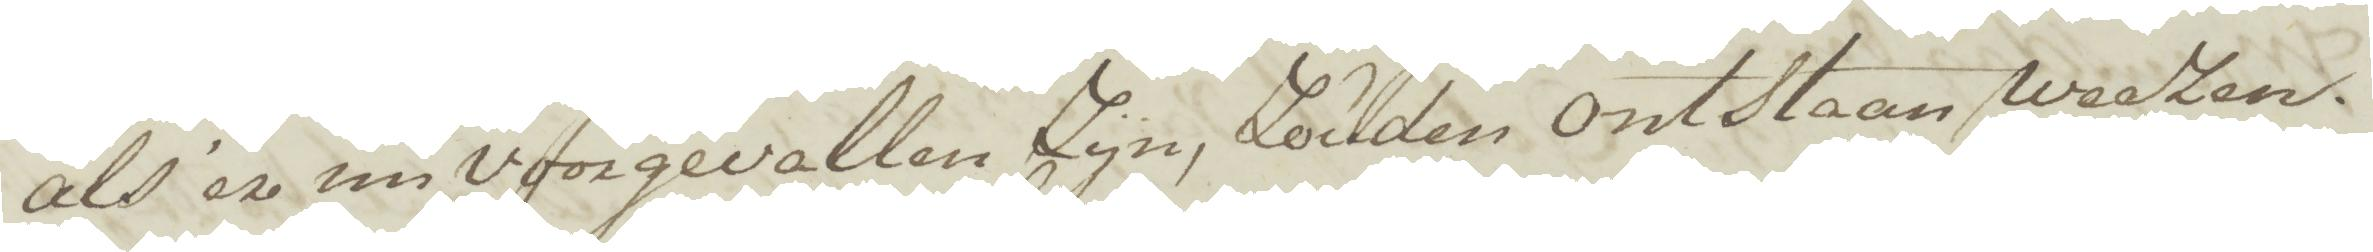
als 'er nu voorgevallen zijn, zouden ontstaan weezen.
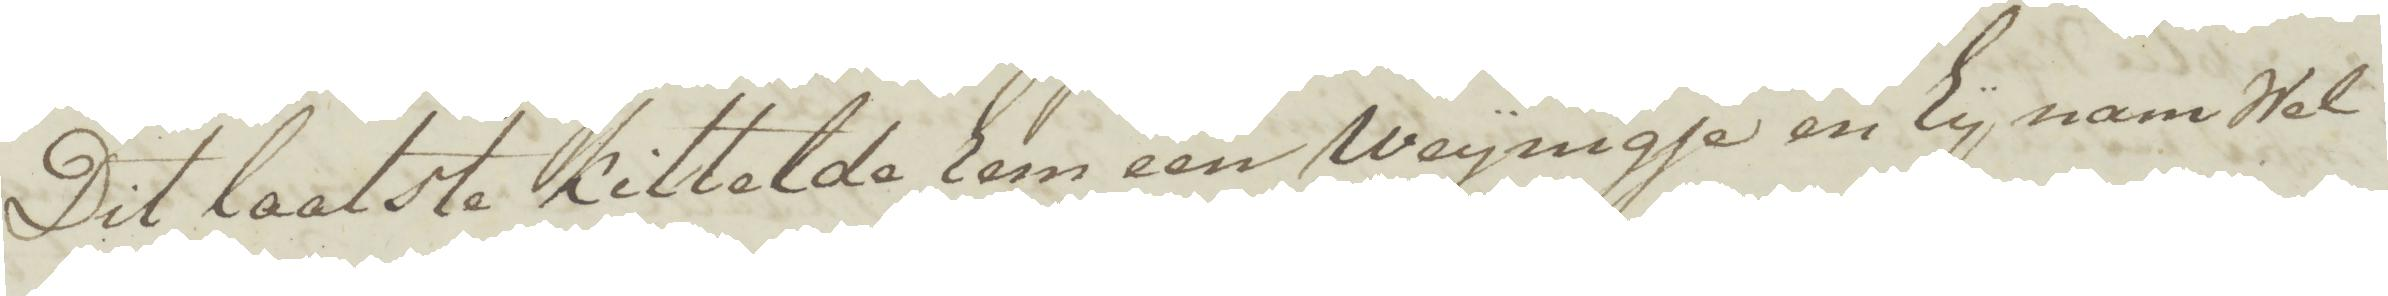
Dit laatste kittelde hem een weijnigje en hij nam wel
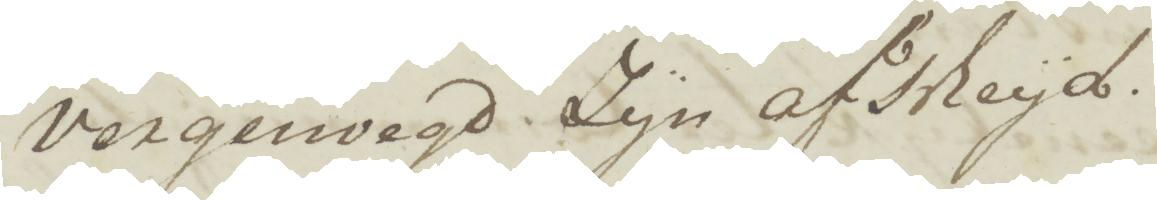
vergenoegd zijn afscheijd.
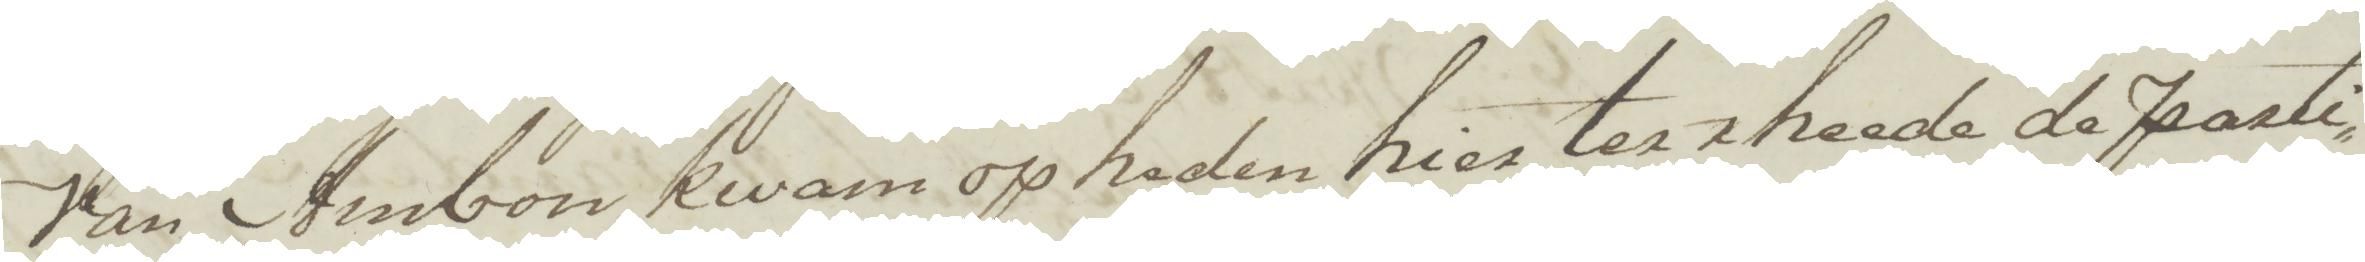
Van Ambon kwam op heden hier ter rheede de parti„
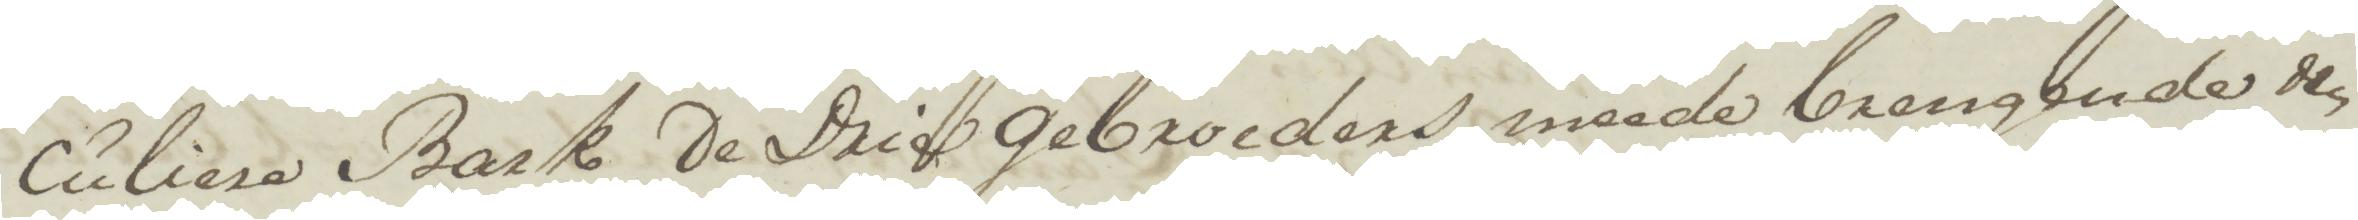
culiere Bark de Drie gebroeders, meede brengende den
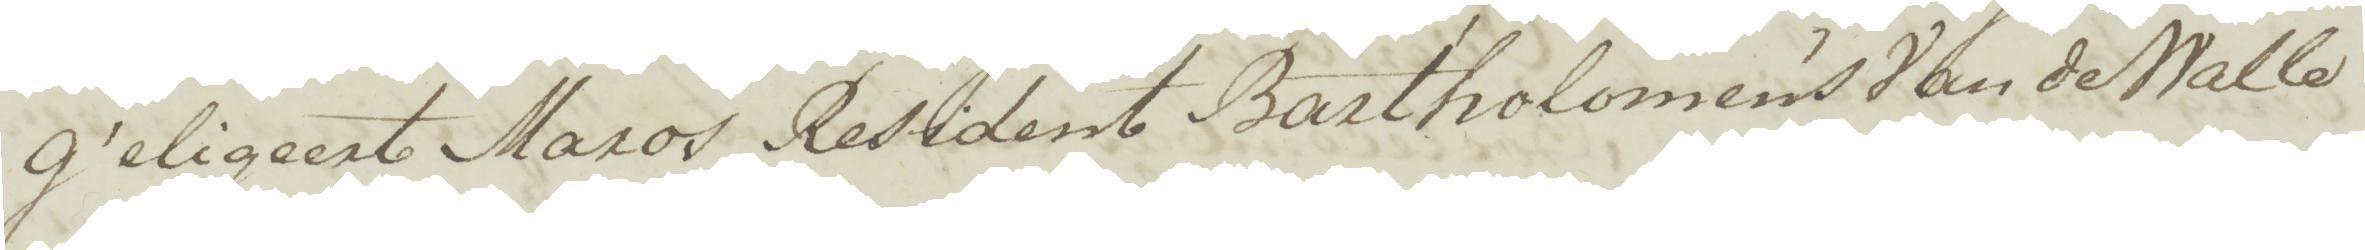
g'eligeert Maros Resident Bartholomeus Van de Walle
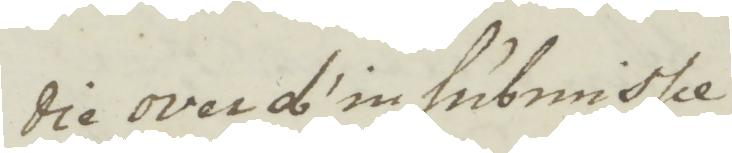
die over d'in submissie
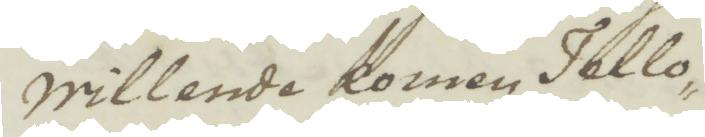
willende komen Tello„
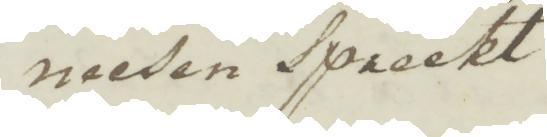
neesen spreekt
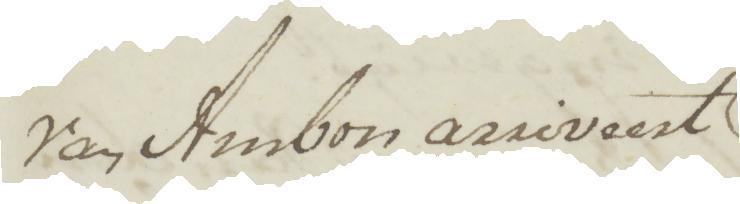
van Ambon arriveert
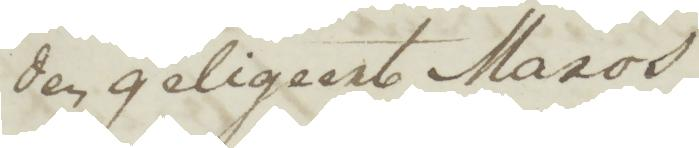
den g'eligeert Maros
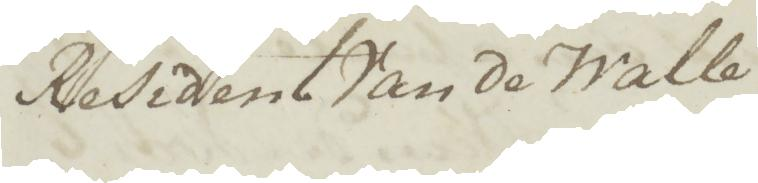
Resident Van de Walle
